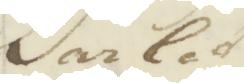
Sarles
